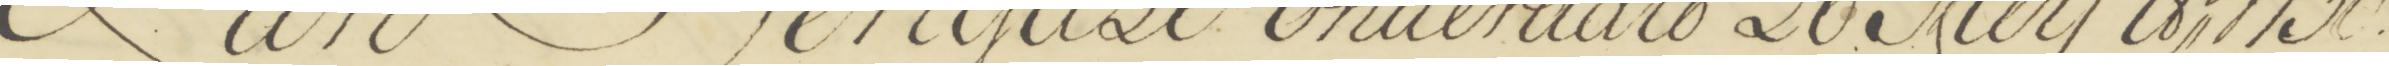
Van Bengale Onder dato 26' Meij A„o 1730.
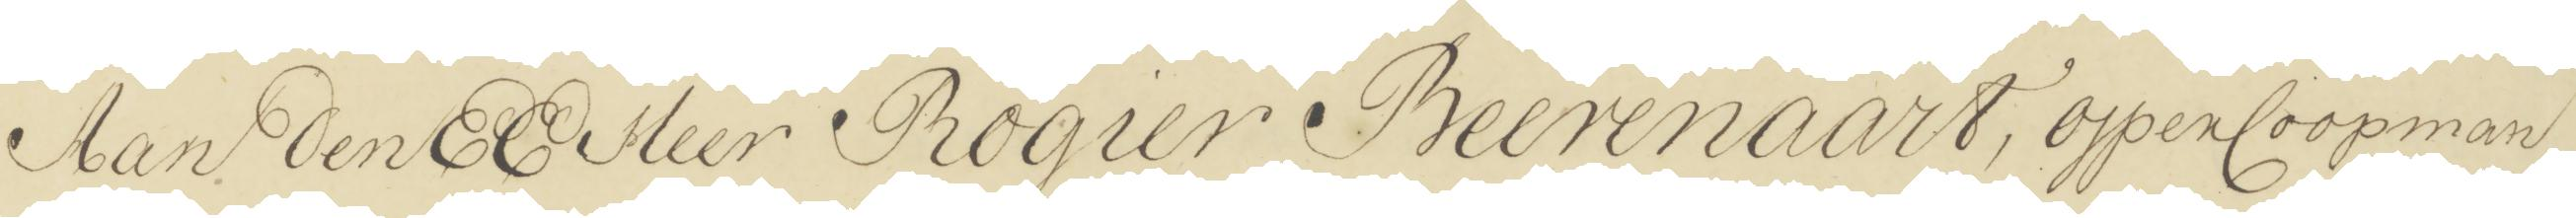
Aan den E E Heer Rogier Beerenaart, opperCoopman
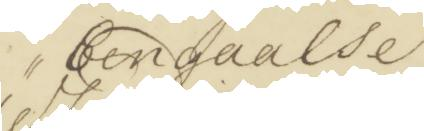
„bengaalse
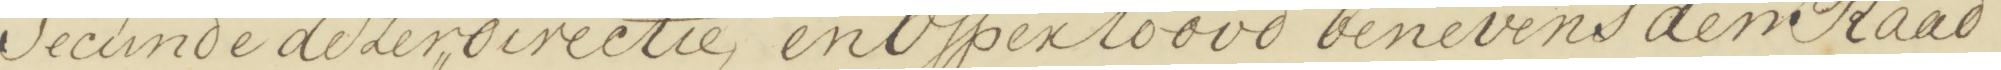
secunde dezer „ directie en Opperhoovd benevens den Raad
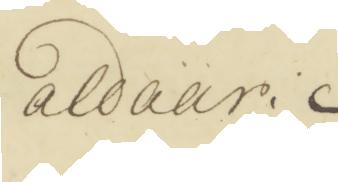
aldaar:_
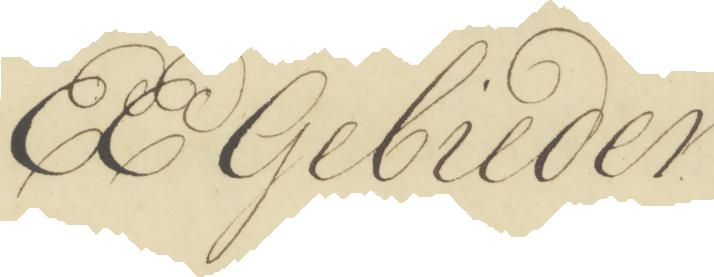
EE Gebieder
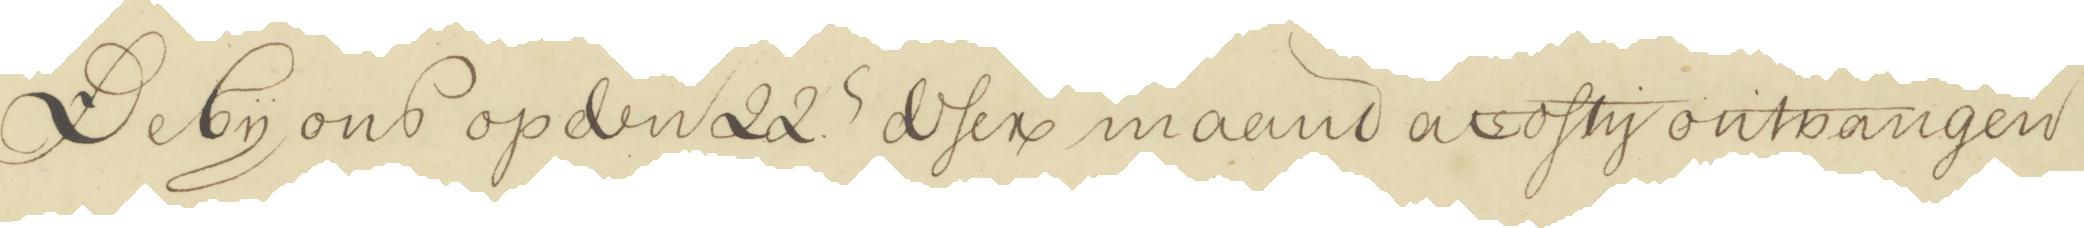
De bij ons op den 22.' deser maand acostij ontvangen
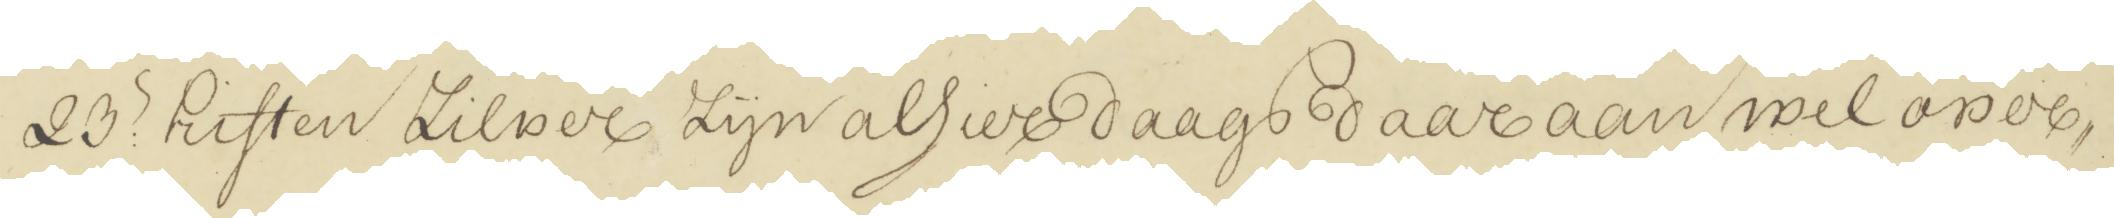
23:' kisten zilver zijn alhier daags daar aan wel over„
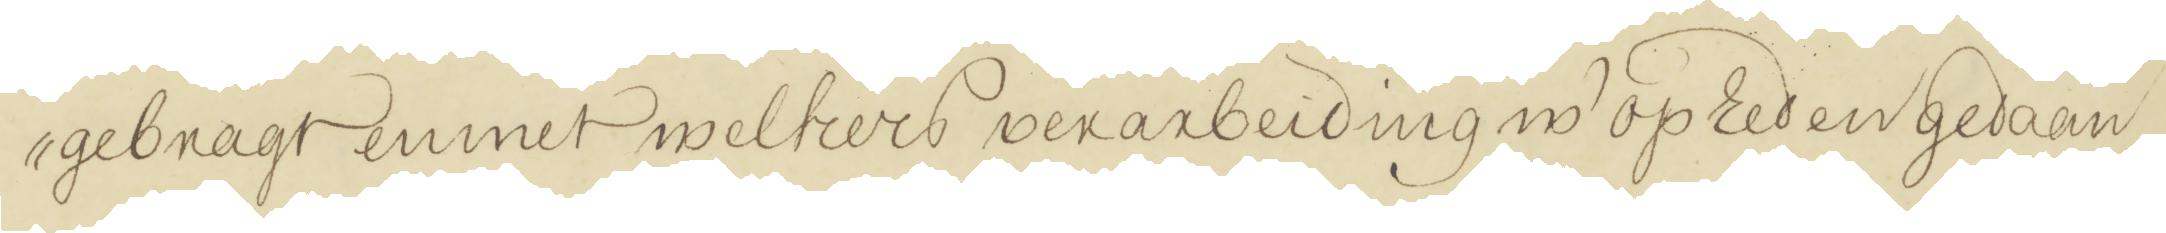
„gebragt en met welkers verarbeiding w' op heden gedaan
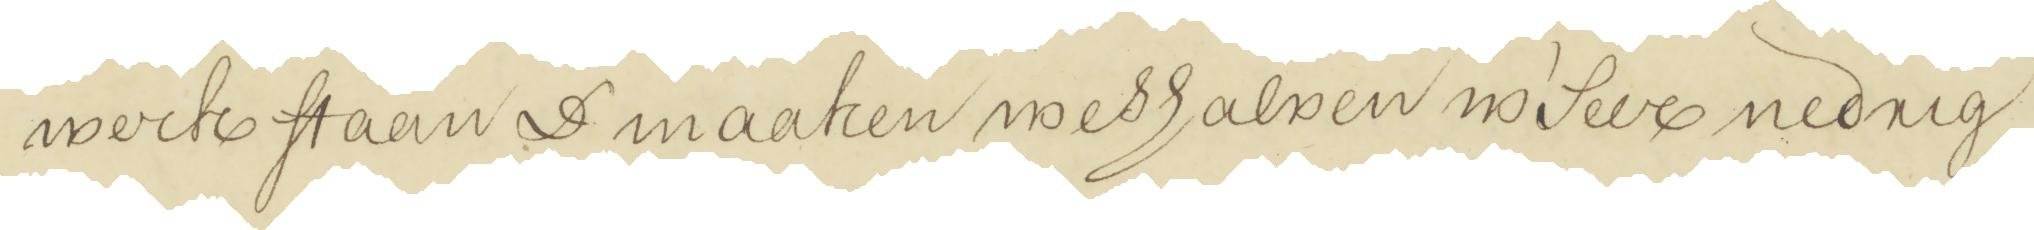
werk staan te maaken weshalven w' seer nedrig
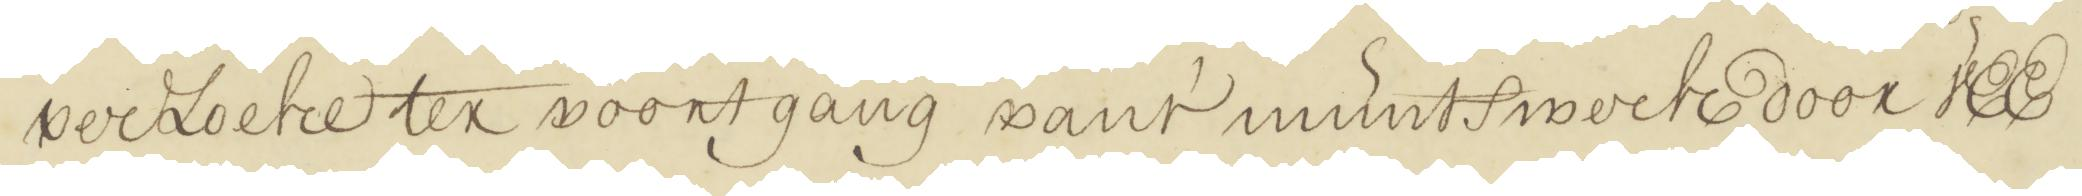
verzoeke ter voortgang van t' muntswerk door VEE
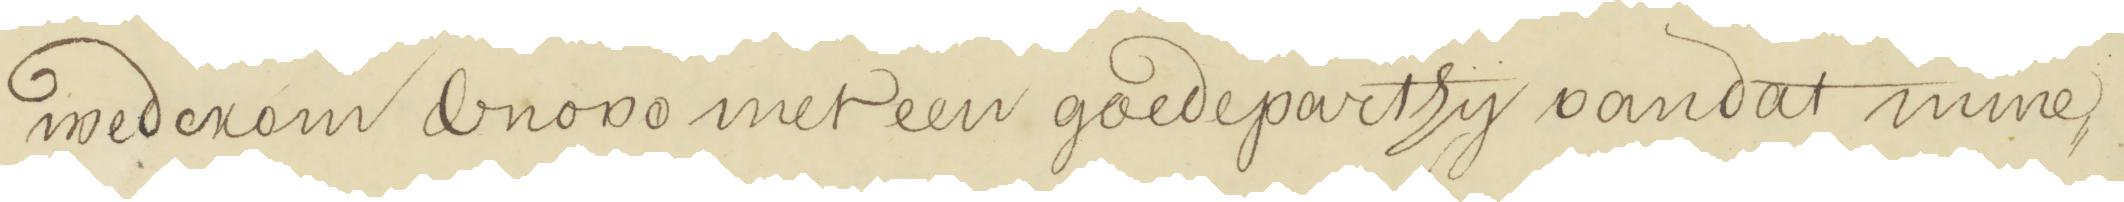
wederom de novo met een goede parthij van dat mine„
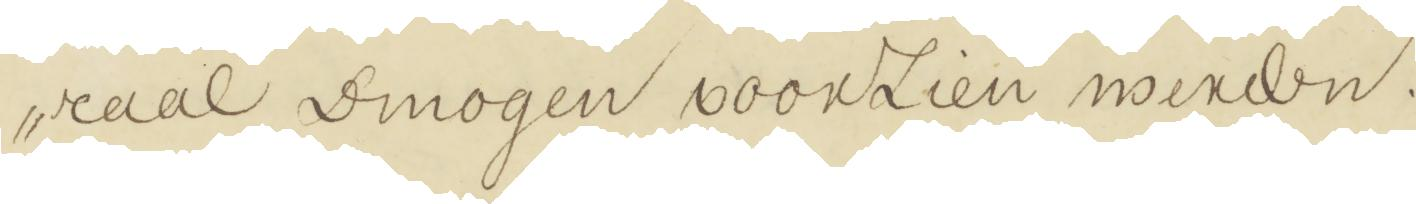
„raal te mogen voorzien werden
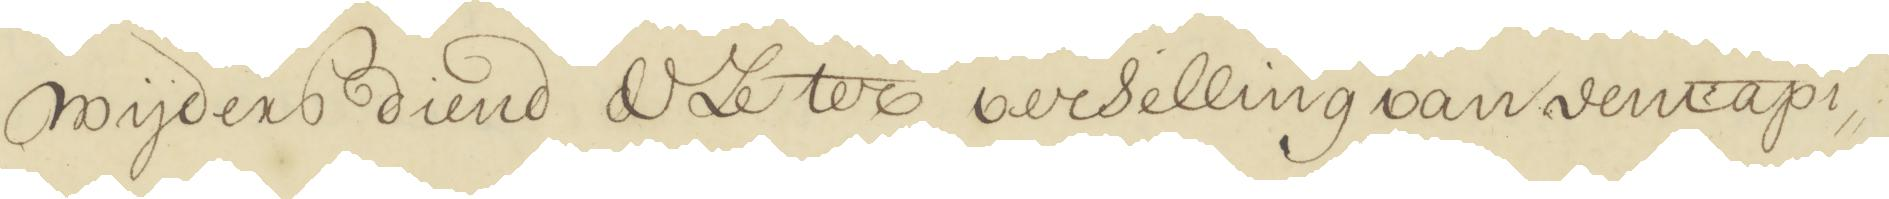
wijders diend deze ter verselling van een capi„
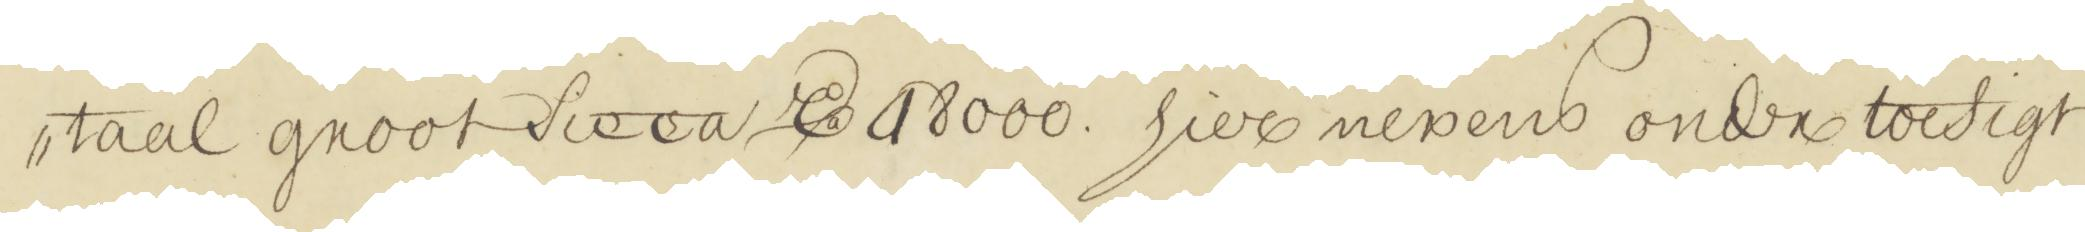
„taal groot sicca ro/a 48000. hier nevens onder toesigt
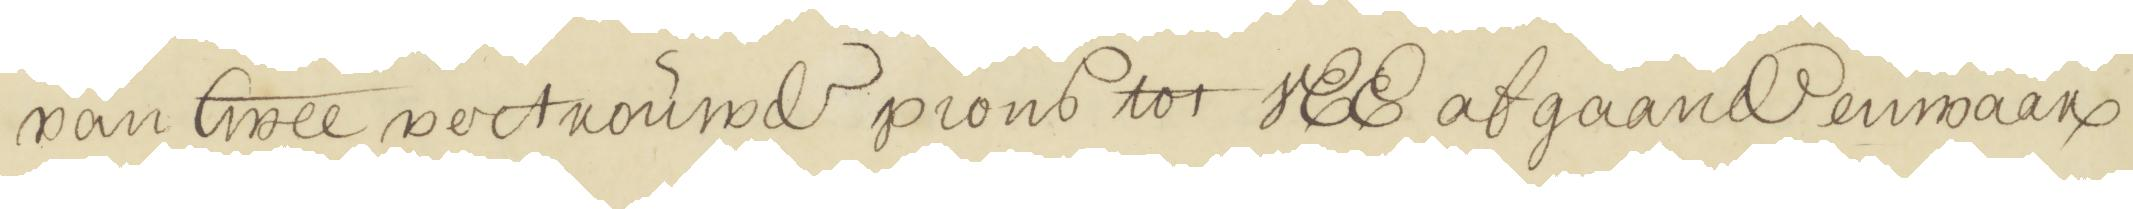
van twee vertrouwde pions tot VEE afgaande enwaar
